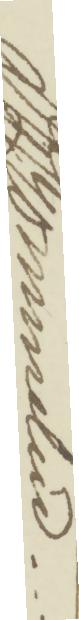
DFCrommelin..
